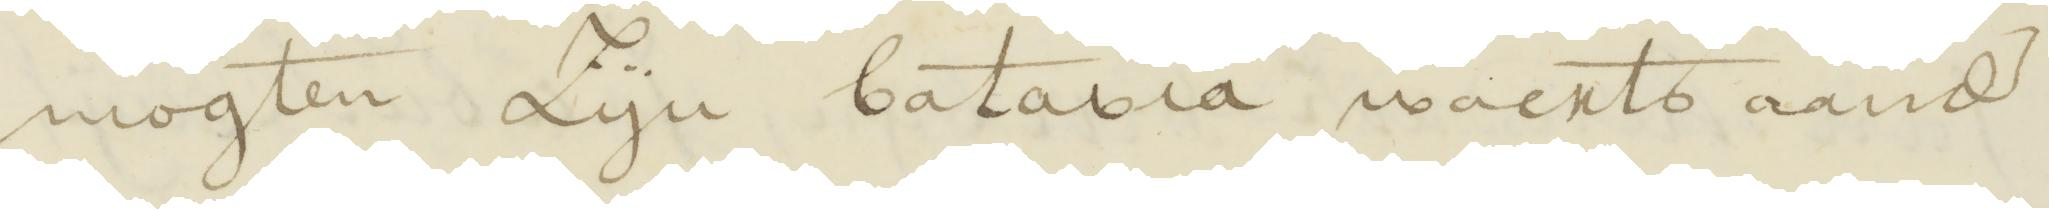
mogten zijn batavia waerts aande
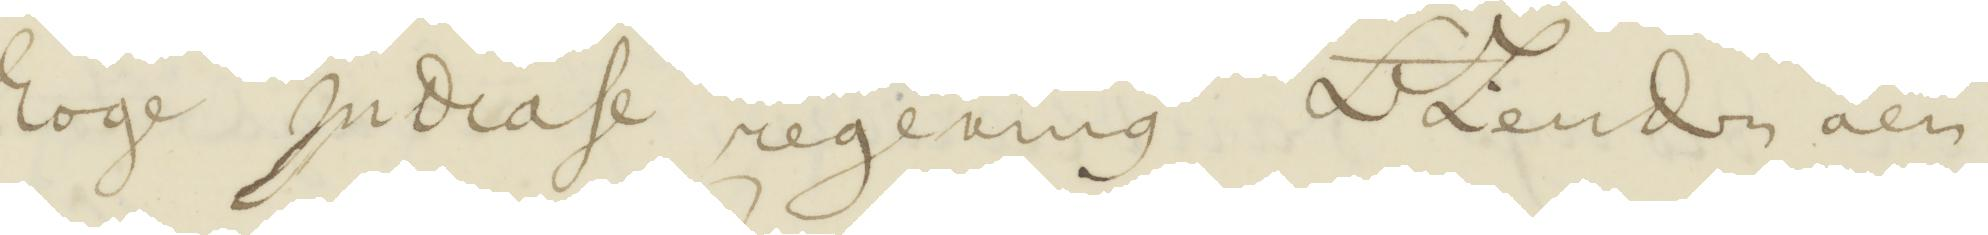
hoge jndiase regering tezenden aen
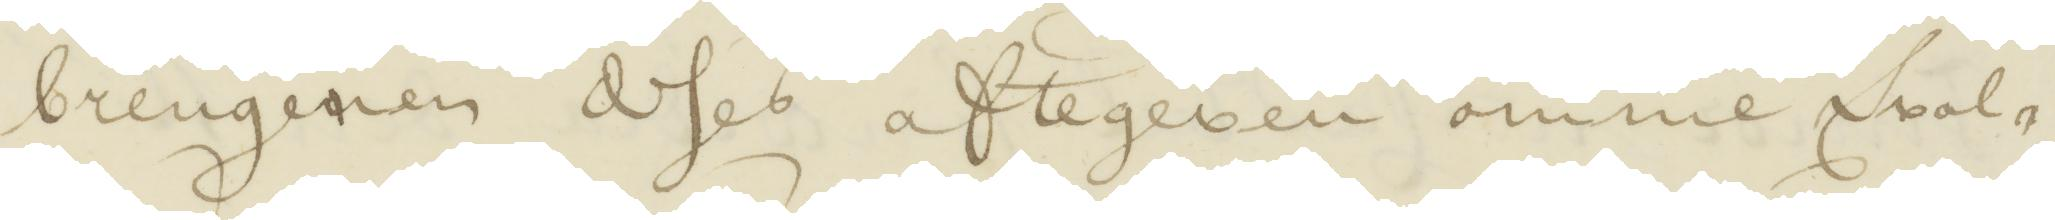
brengen en deses aftegeven omme vervol„
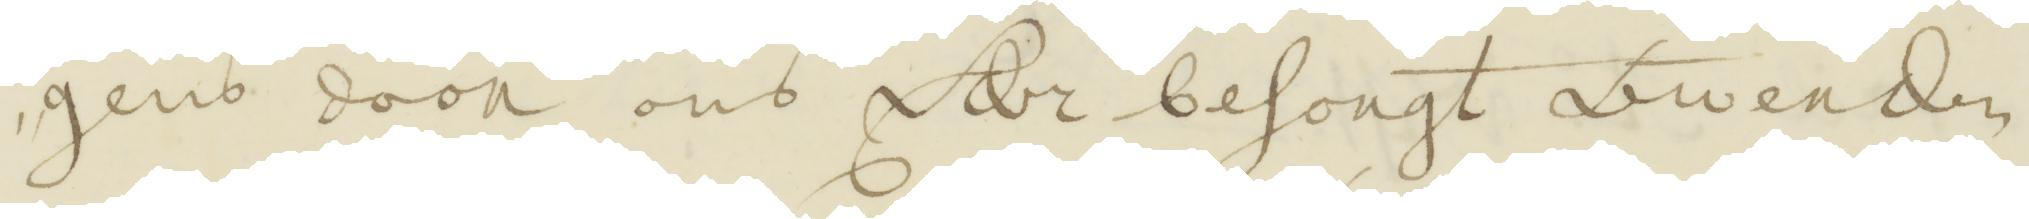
„gens door ons verder besorgt tewerden
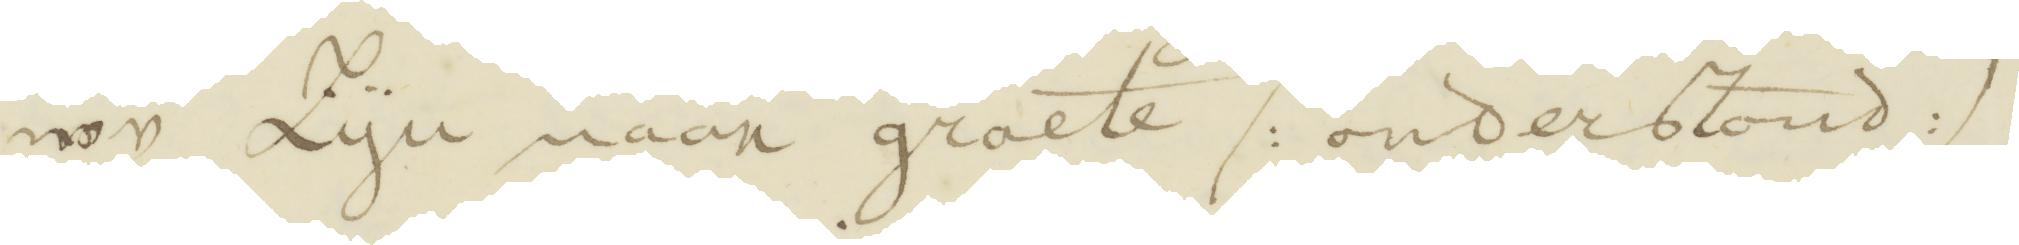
wij zijn naar groete /:onderstond:/
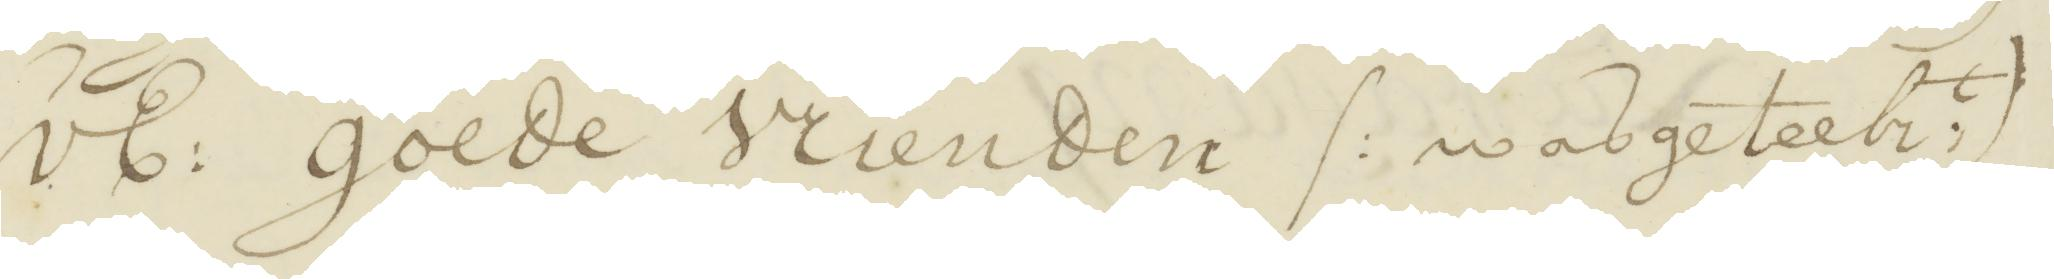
vE: goede vrienden /:was geteek:t/
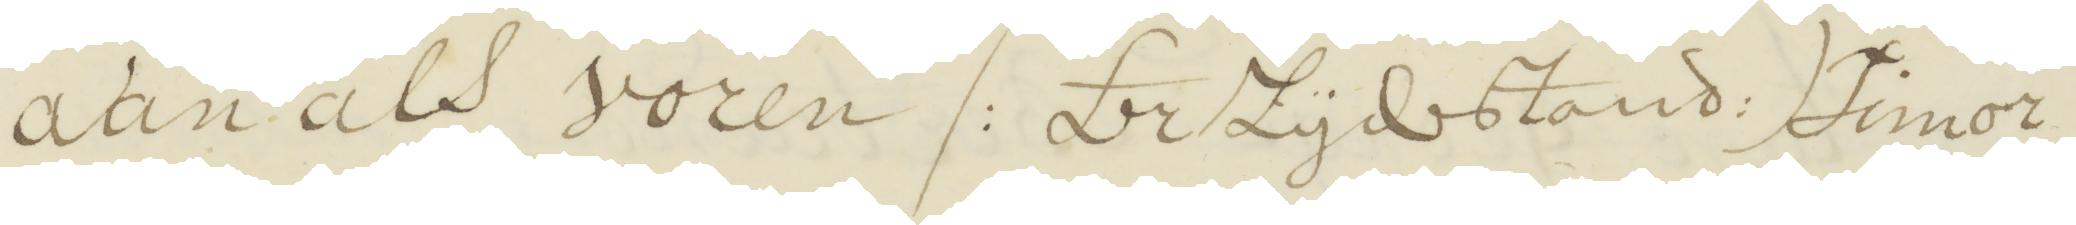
aan als voren /: ter zijdestond:/ Timor
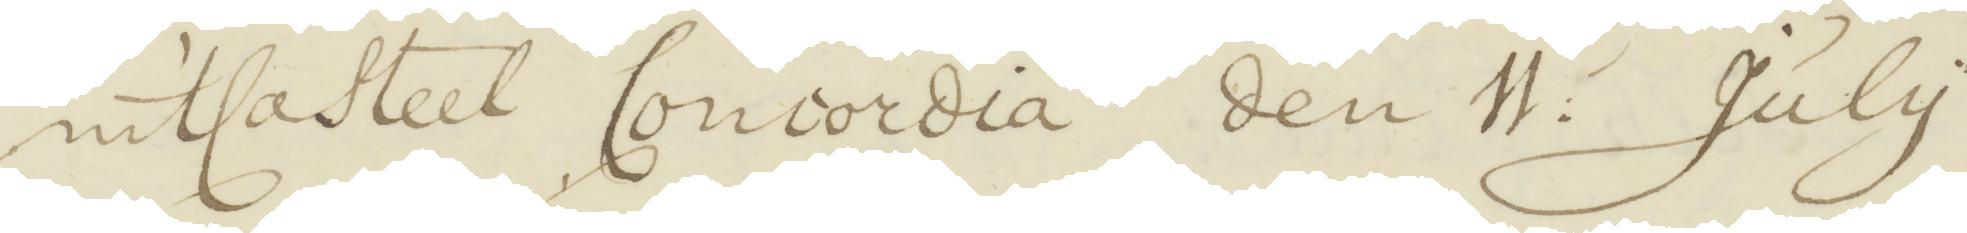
in't Casteel Concordia den 11:en Julij
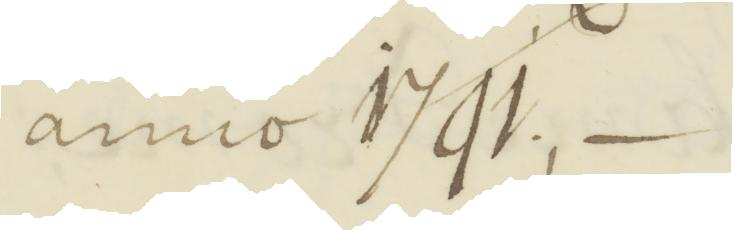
anno 1741; —
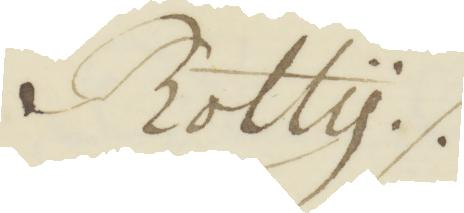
Rottij./.
